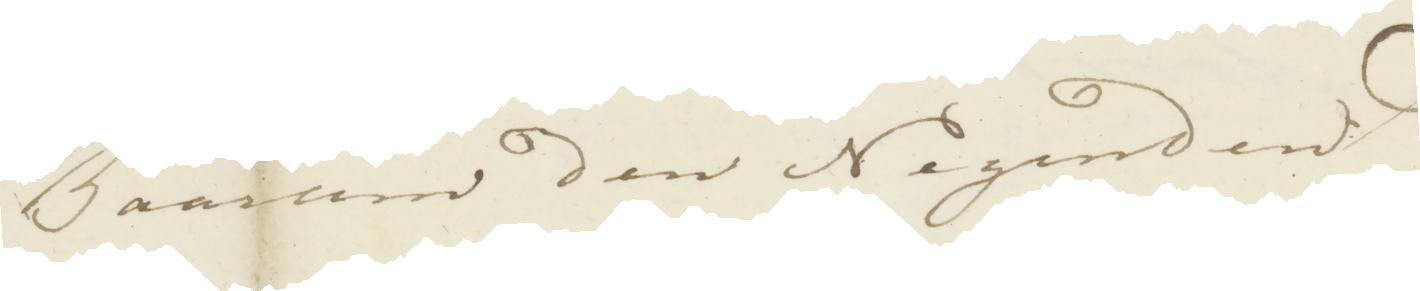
Haarlem den Negenden
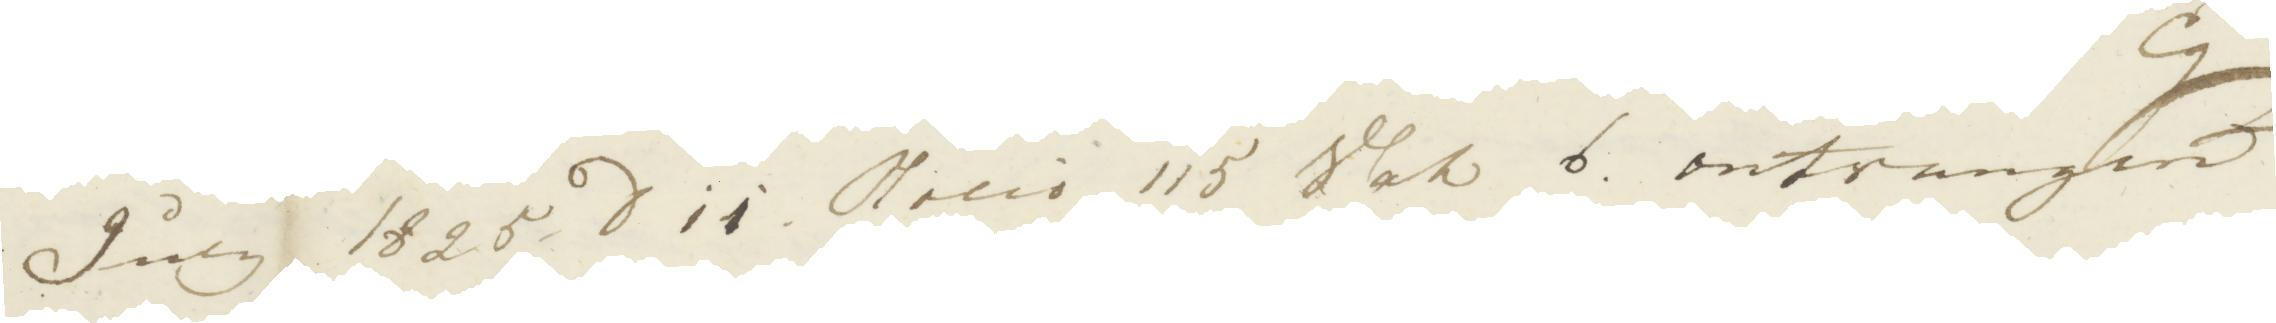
July 1825, d ii. Folio 115 Vak 6. ontvangen
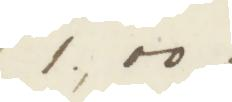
1.,00.
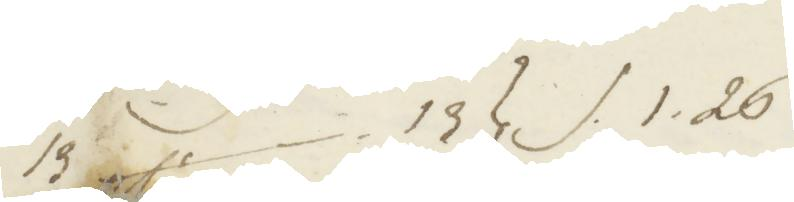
13 ,, pc — - 13 ƒ. 1.26
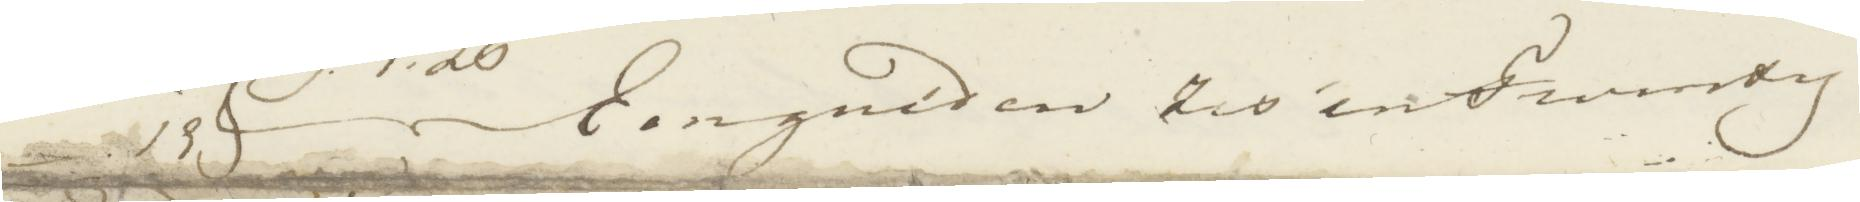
— - 13 — Een gulden zes en Twintig
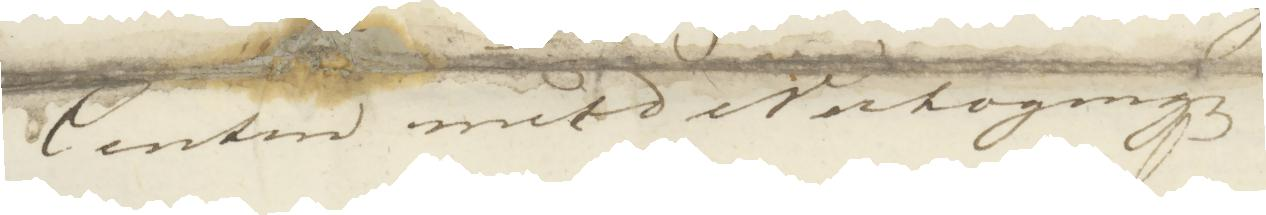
Centen met de Verhogingen.
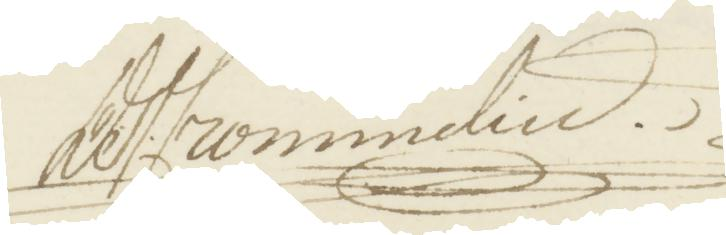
D. F: Crommelin.
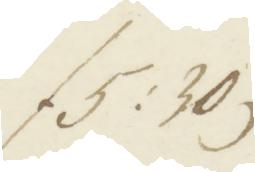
ƒ5:30
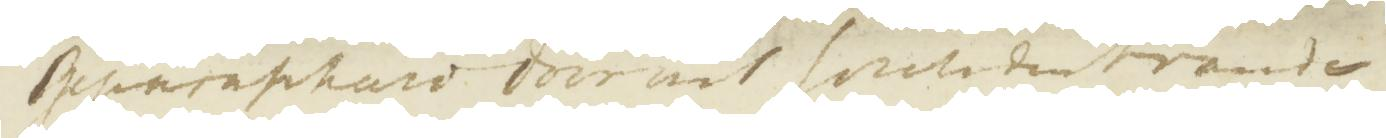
Geparapheerd door ons sorch en t van de
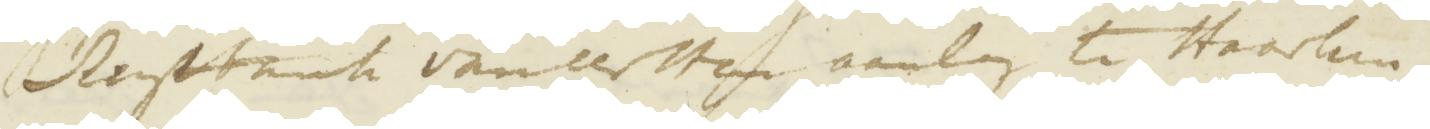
Regtbank van eersten aanleg te Haarlem,
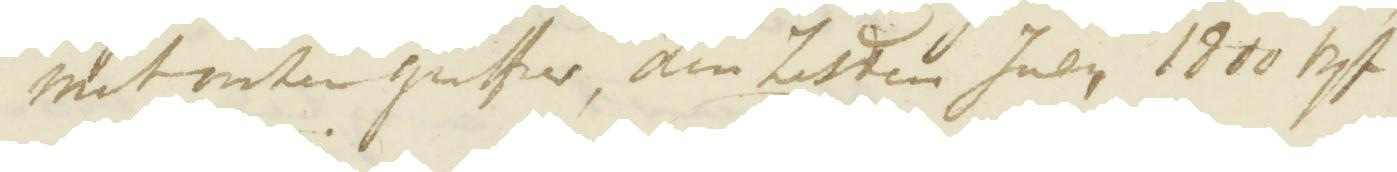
met onsen griffier, den Zesten July 1800 vyf
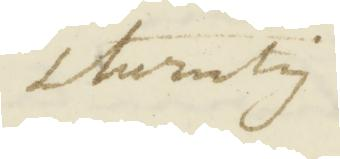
entwintig
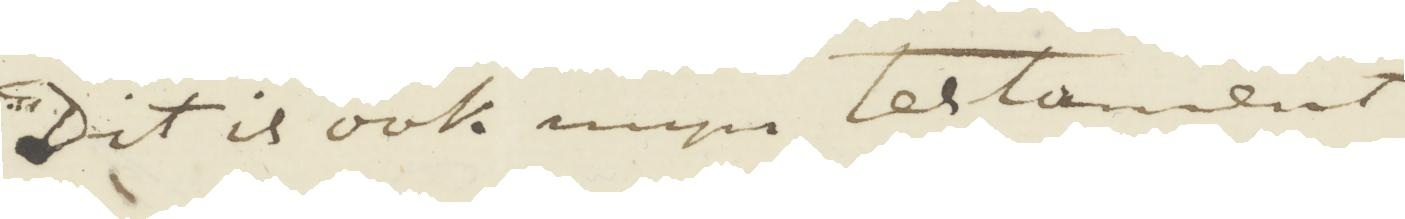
Dit is ook myn testament
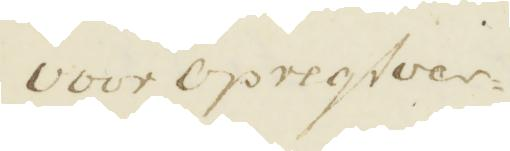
voor opregt ver
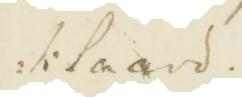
:klaard
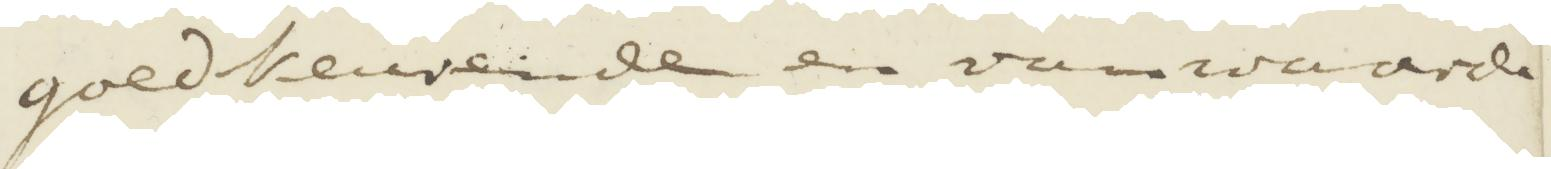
goedkeurende en van waarde
